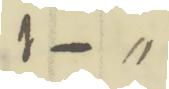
1 – „
